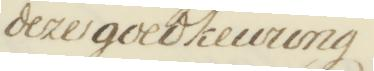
deze goedkeuring
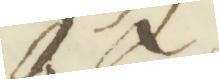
J. Z
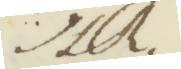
HR.
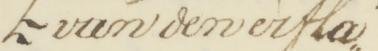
¶ van den erfla„
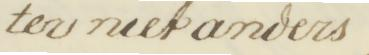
ter niet anders
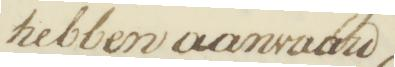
hebben aanvaard
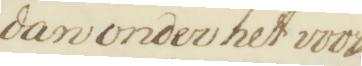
dan onder het voor
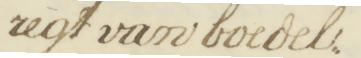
regt van boedel„
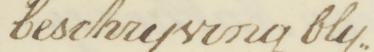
beschryving bly„
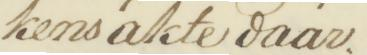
kens akte daar,
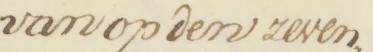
van op den zeven„
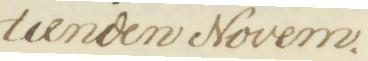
tien den Novem,
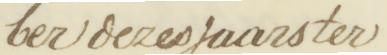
ber dezes jaars ter
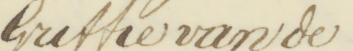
Griffie van de
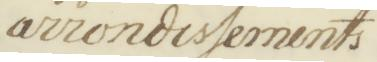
arrondissements
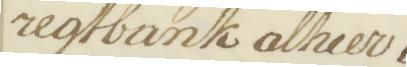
regtbank alhier„
